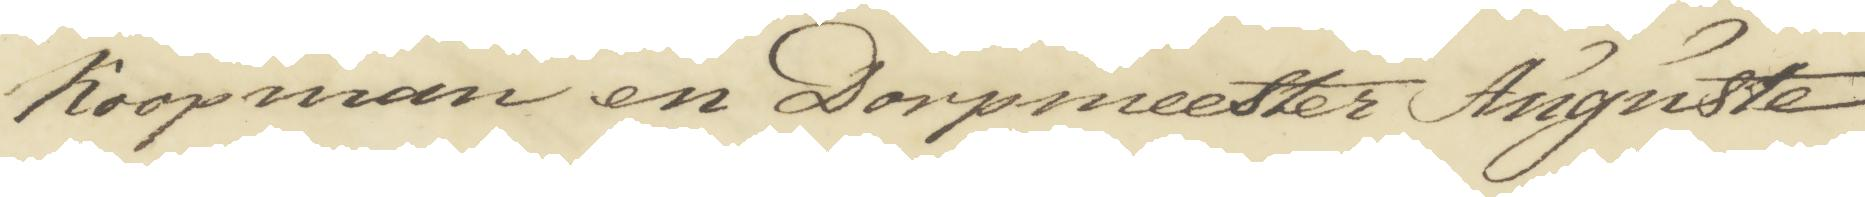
Koopman en Dorpmeester Auguste
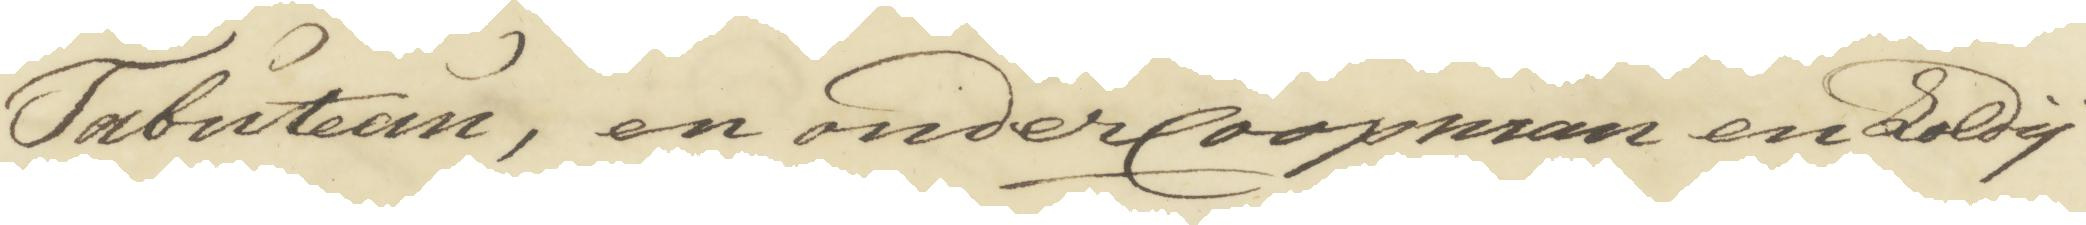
Tabuteau, en ondercoopman en Zoldij
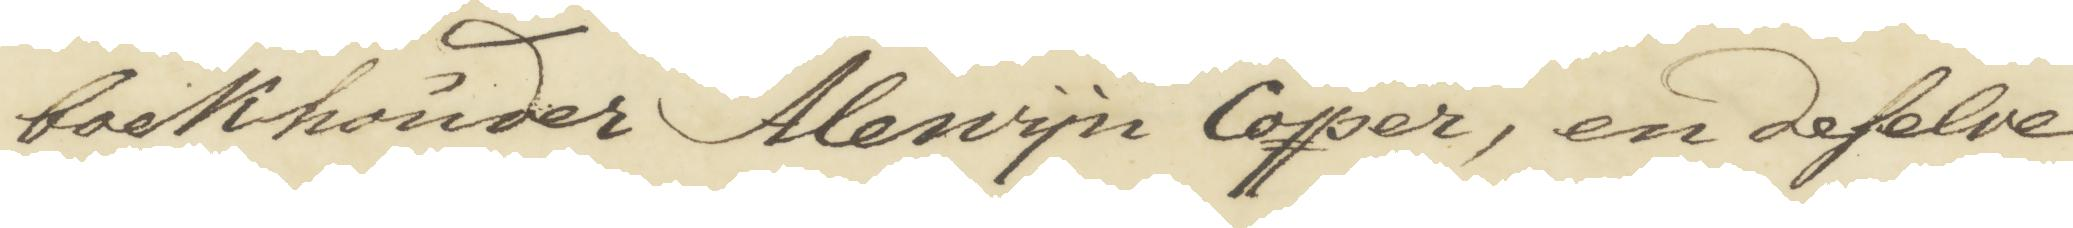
boekhouder Alewijn Copper, en deselve
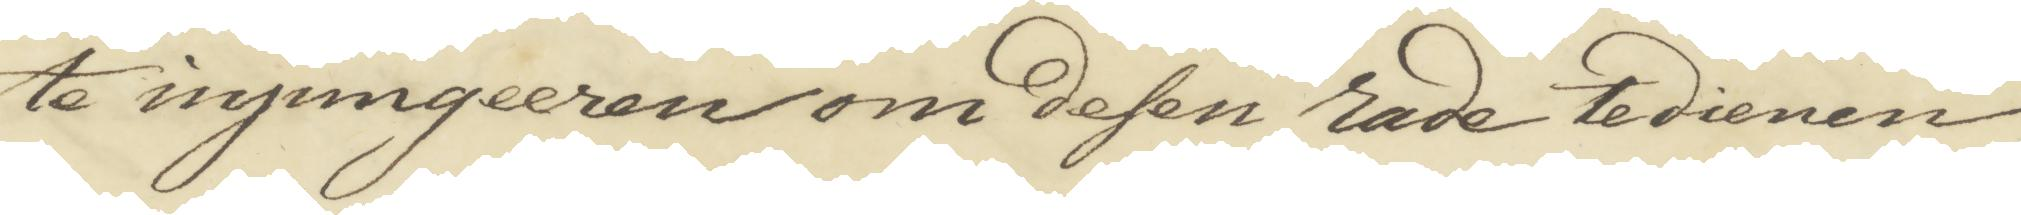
te injungeeren om desen rade te dienen
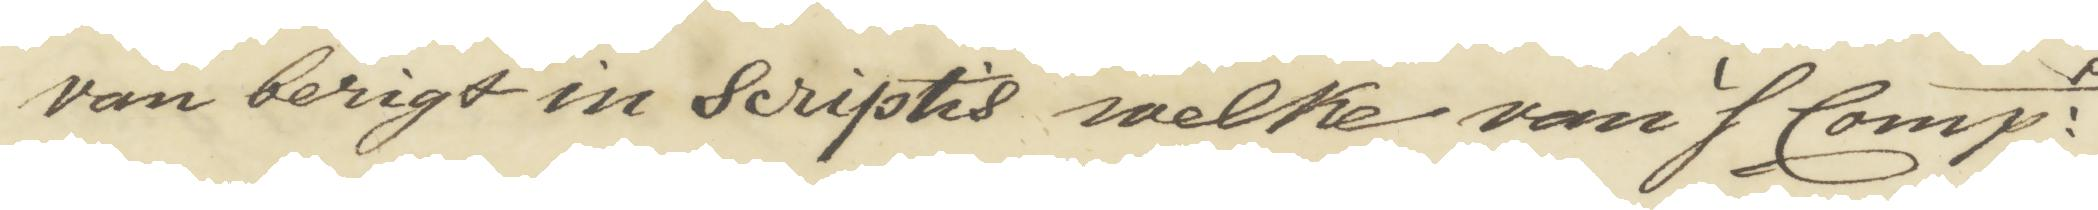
van berigt in scriptis welke van ’s Comp:s
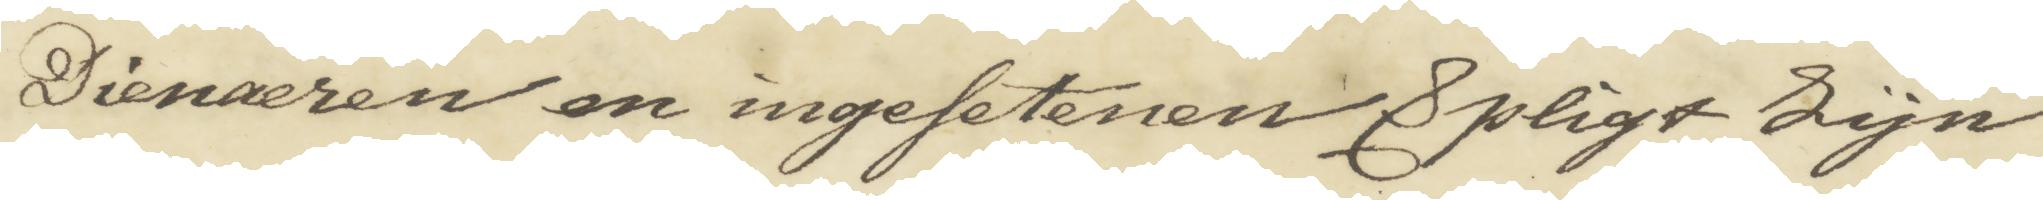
Dienaeren en ingesetenen verpligt Zijn
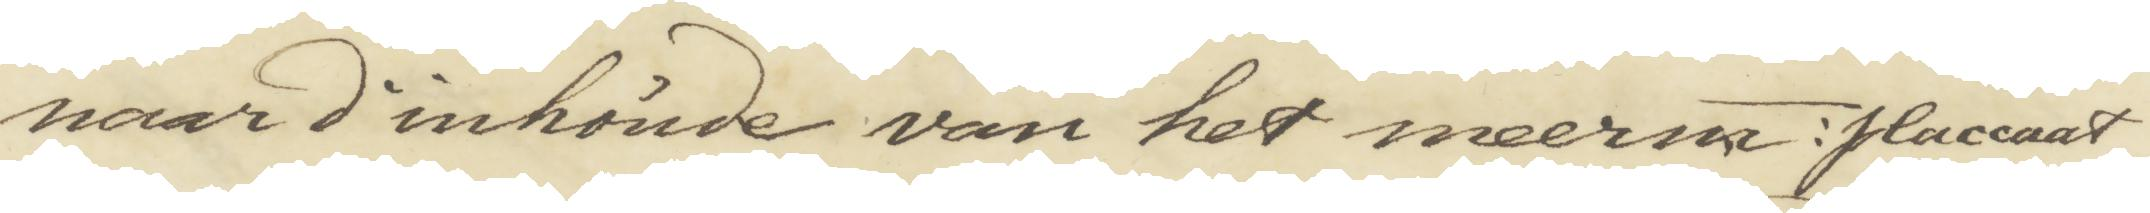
naar d'inhoude van het meerm: placcaat
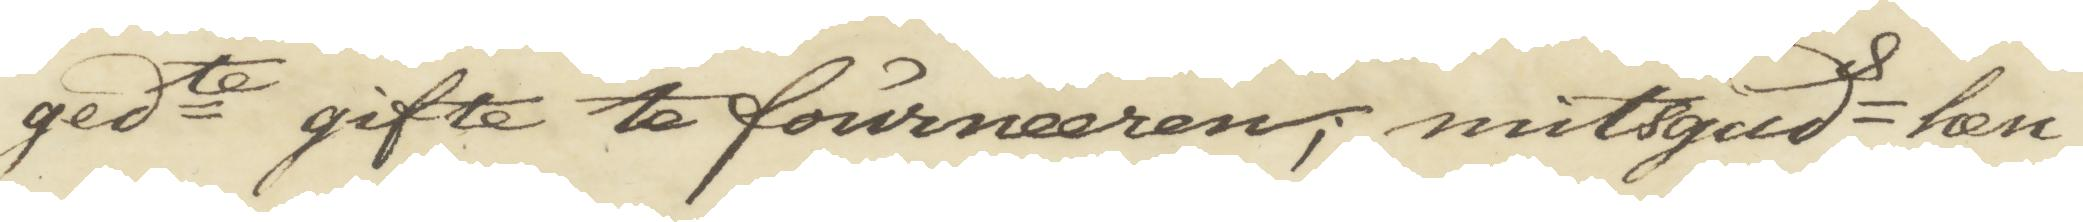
ged=te gifte te fourneeren; mitsgad=s hen
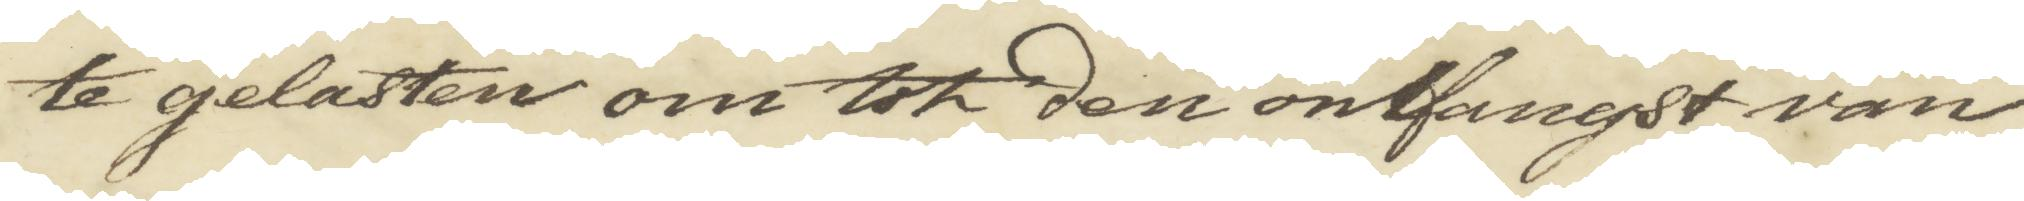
te gelasten om tot den ontfangst van
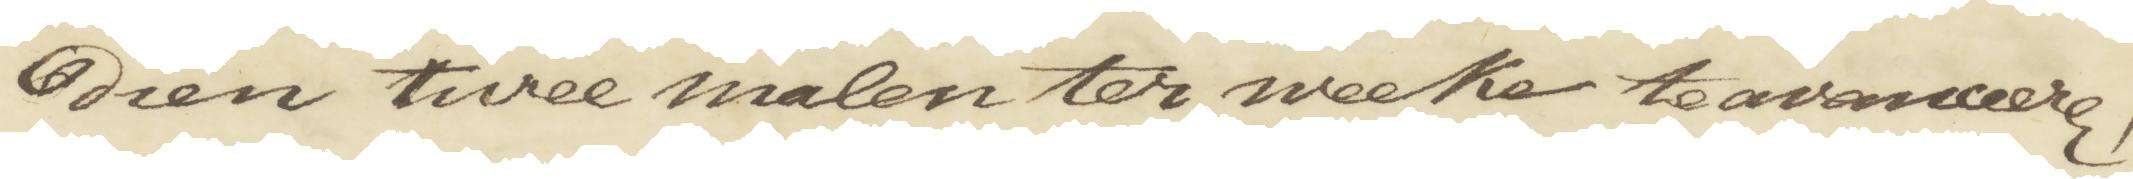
dien twee malen ter weeke te avanceeren,
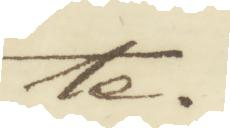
te.
